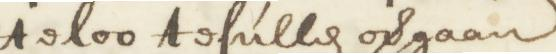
te loo te sullen overgaan
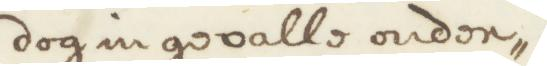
dog in gevalle onder„
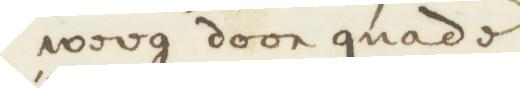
„weeg door quade
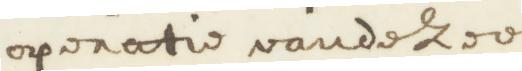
operatie vandezee
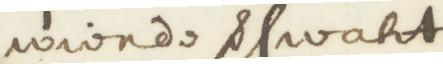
wierde verswakt
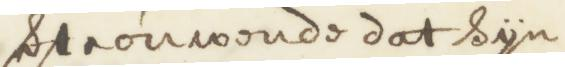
vertrouwende dat sijn
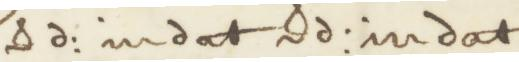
Ed: in dat Ed: in dat
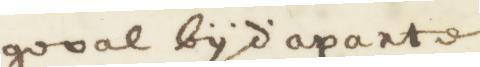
geval bijd’ aparte
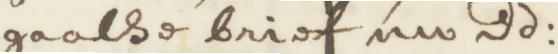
gaalse brief uw Ed:
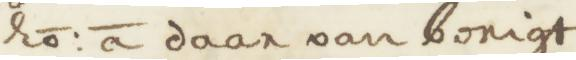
ho: a daar van berigt
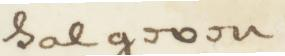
sal geven
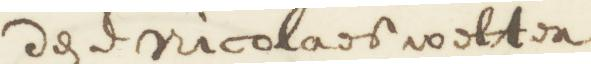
den E nicolaes welter
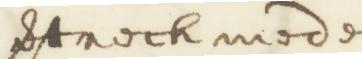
vertreck mede
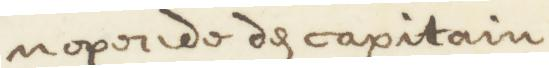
nopende den capitain
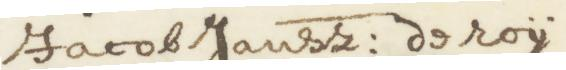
Iacob Jansz: de roij
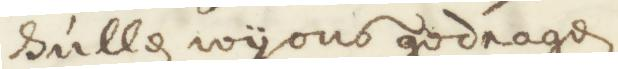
sullen wij ons gedragen
